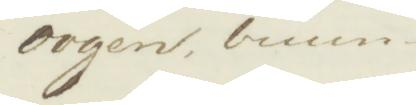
oogen, bruin
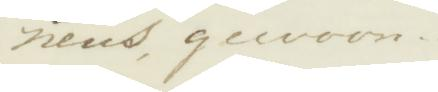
neus, gewoon.
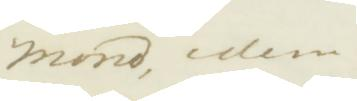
mond, idem
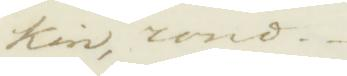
kin, rond. .
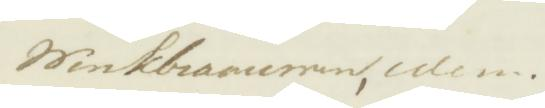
Wenkbraauwen, idem.
